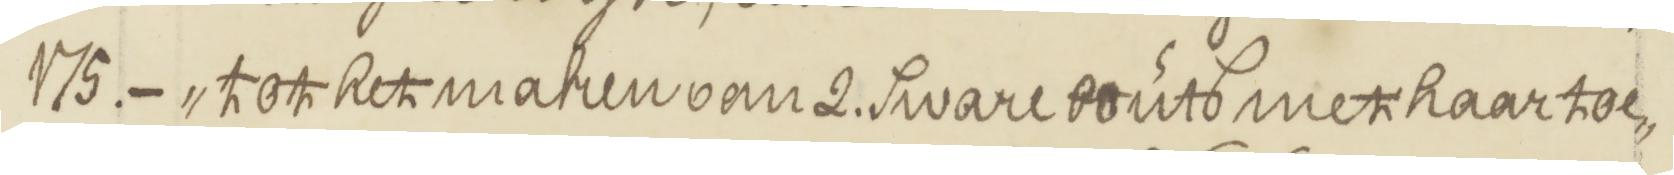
175.- „ tot het maken van 2. sware bouts met haar toe„
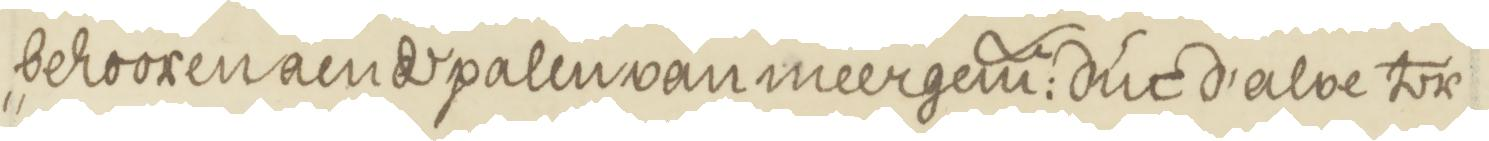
„behooren aen de palen van meergem:e duc d'alve ter
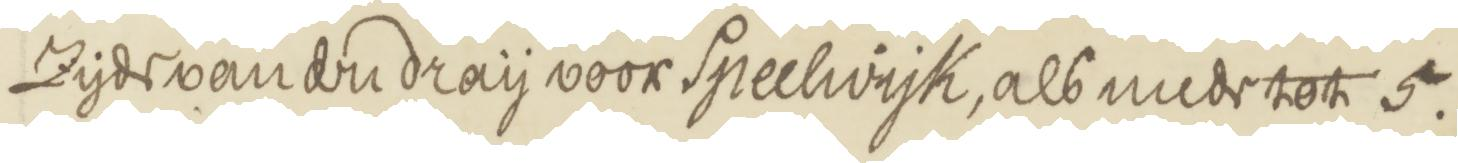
zijde van den draij voor speelwijk, als mede tot 5.
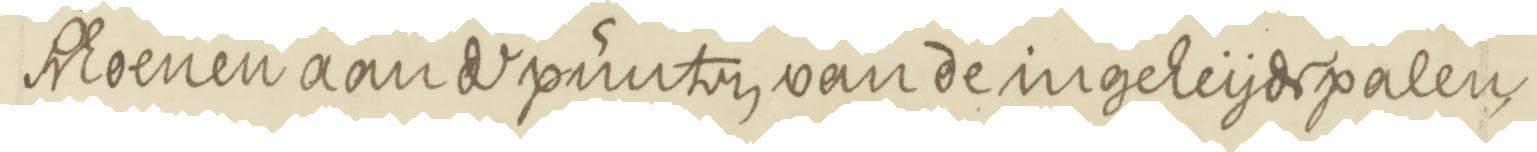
schoenen aan de punten van de ingeheijde palen,
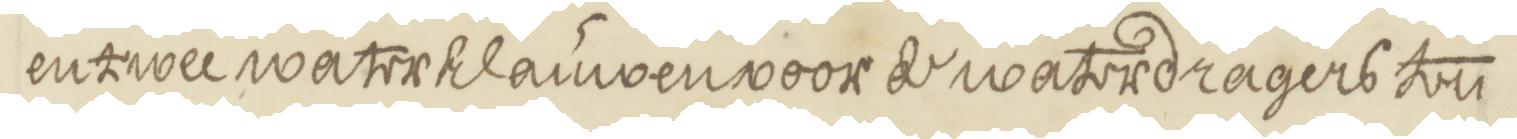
en twee waterklauwen voor de waterdragers ten
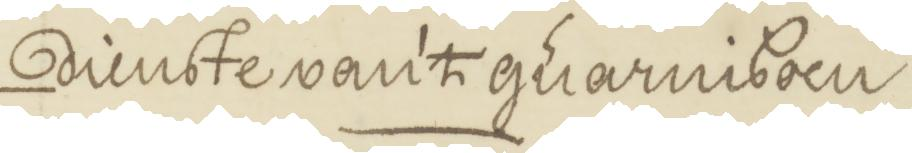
dienste van ’t guarnisoen
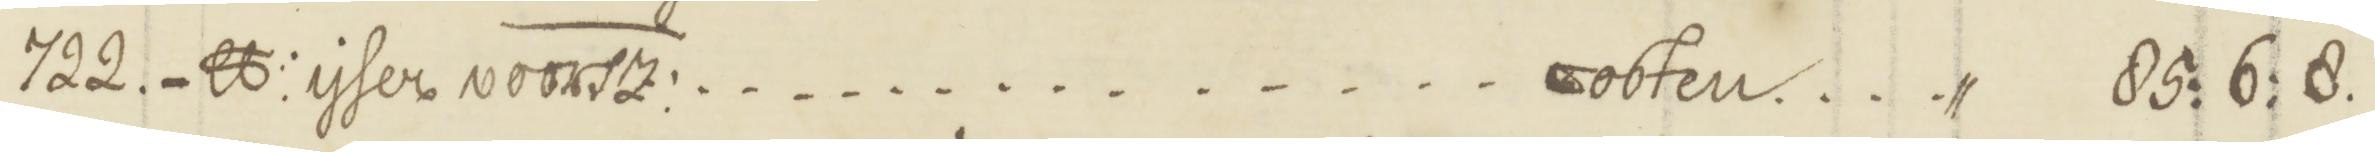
722.- lb: ijser voorsz: . . . . . . . . . . . . . . costen . . . „ 85: 6: 8.
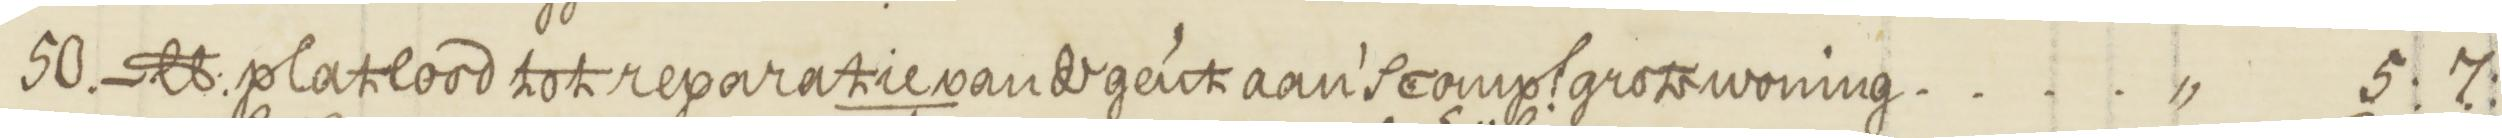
50.- lb: platlood tot reparatie van de geut aan ’s comp:s grote woning . . . . „ 5: 7
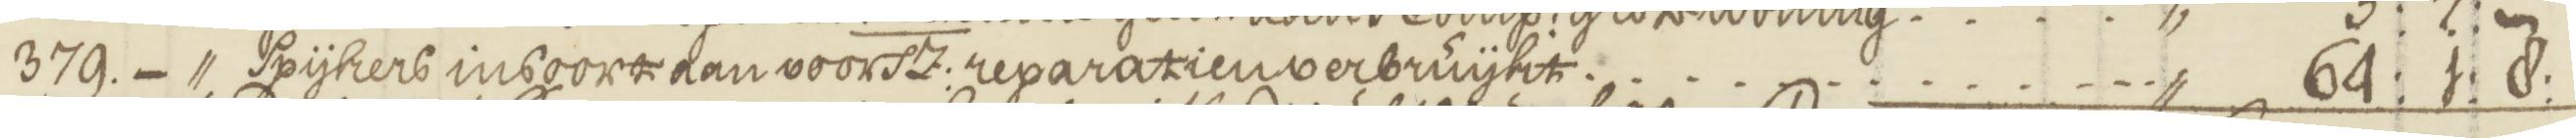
379.- „ spijkers in soort aan voorsz: reparatien verbruijkt . . . . . . . . . . . . . „ 64: 1: 8:
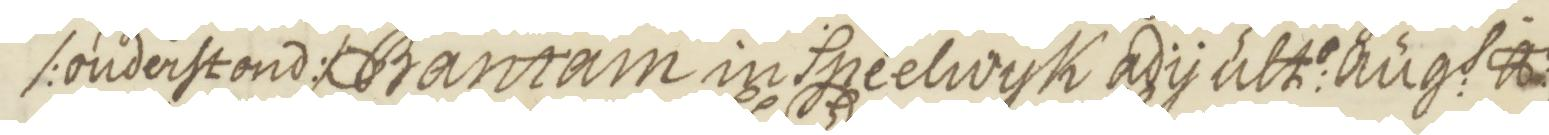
/:onderstond:/ Bantam in speelwijk adij ult:o Aug:s A
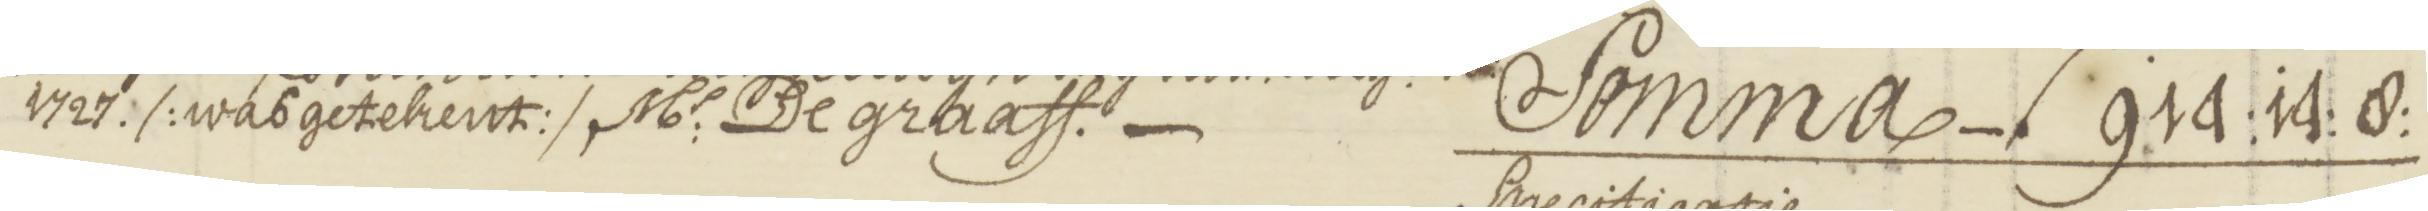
1727. /:was getekent:/ M:s De graaff. — Somma - ƒ 914: 14: 8:
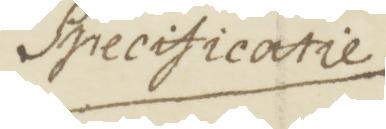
Specificatie
